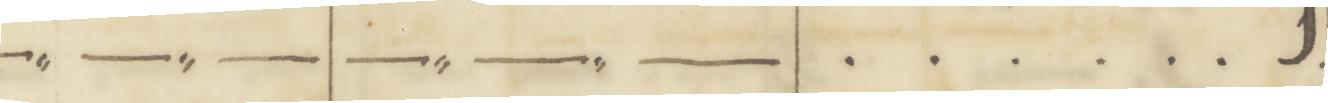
—„ —„ — —„ —„ — . . . . . . 1
